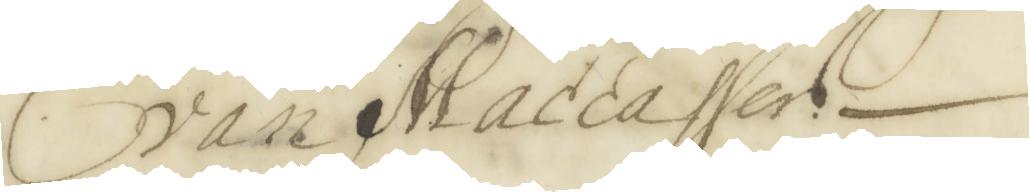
van Maccasser —
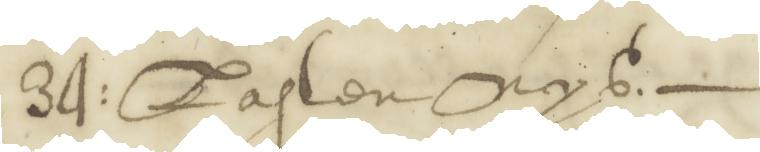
34: lasten rijs. —
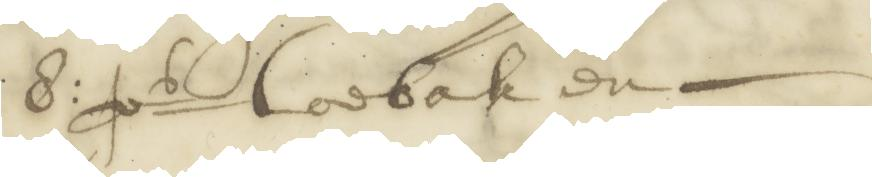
8: p=s toebak en —
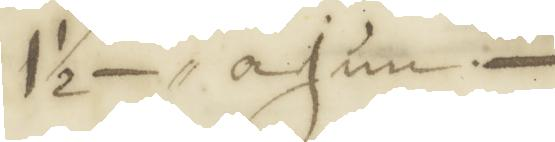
1½ — „ ajun. —
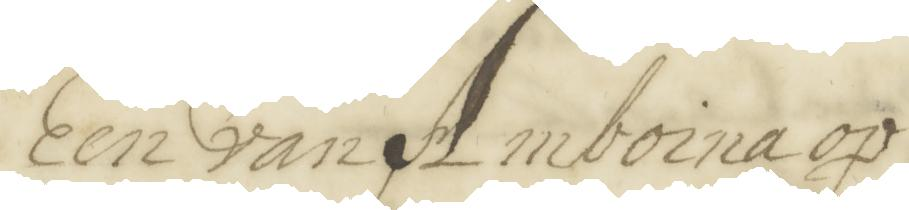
Een van Amboina op
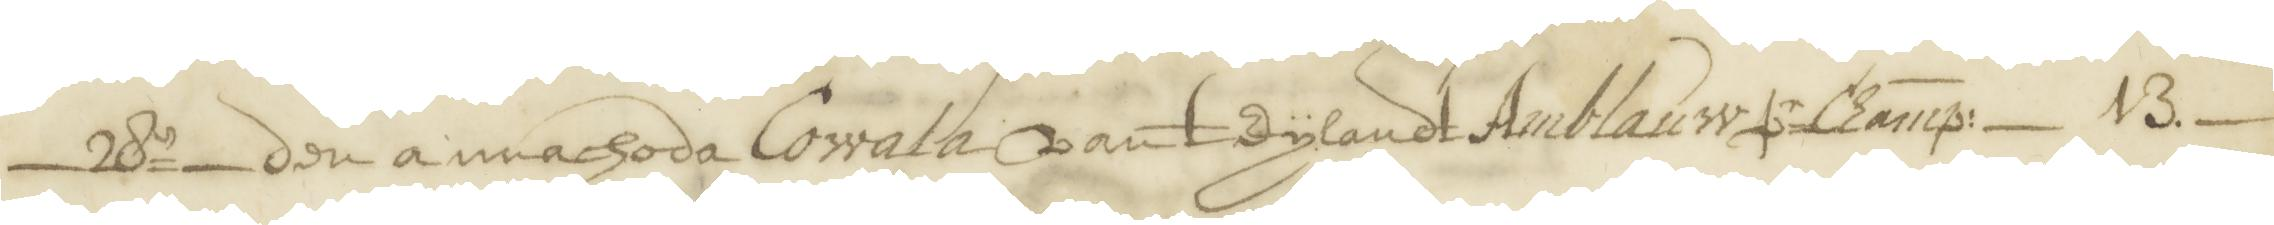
— 28=en — den annachoda Cowala van 't eijlandt Amblauw p=r Champ: — 13. —
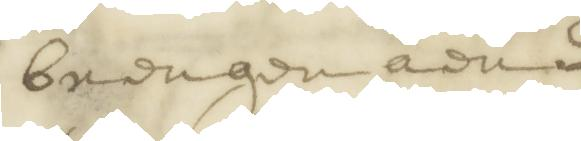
brengen aen .
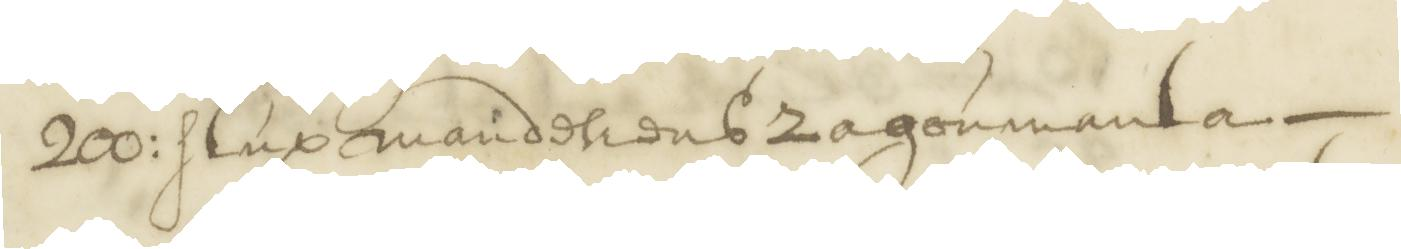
200: stux mandekens zagoumanta —
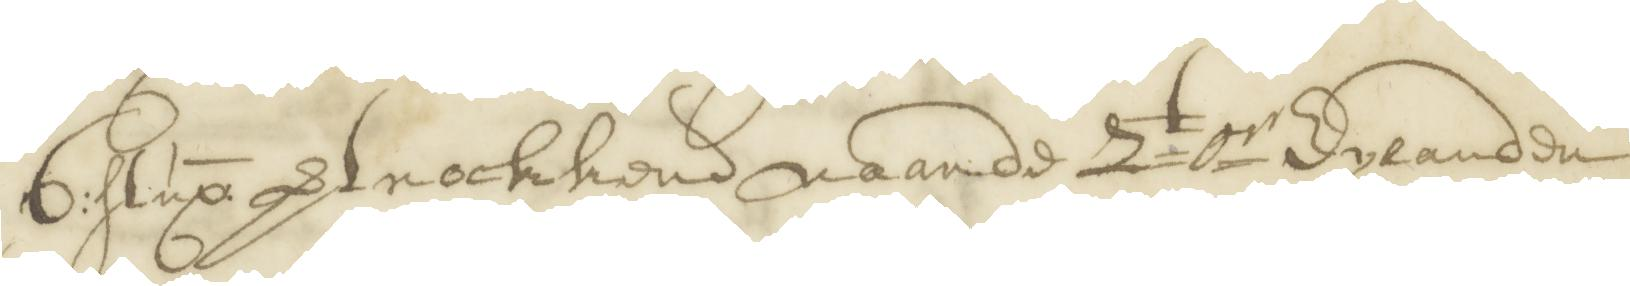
6: stux vertrockkend naar de z=t o=r Eylanden
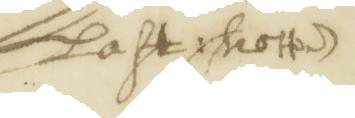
last: koppen
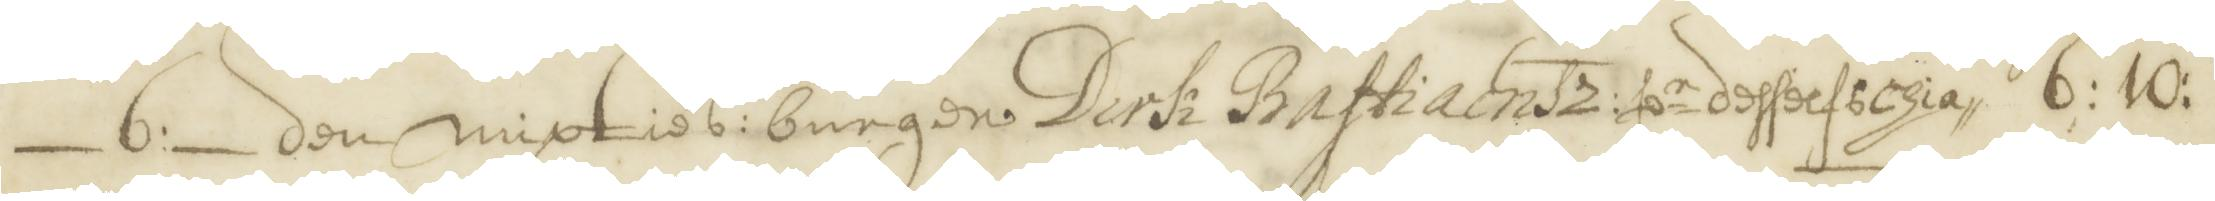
— 6: — den mixties: burger Dirk Bastiaensz: p=r desselfs Chia„ 6: 10:
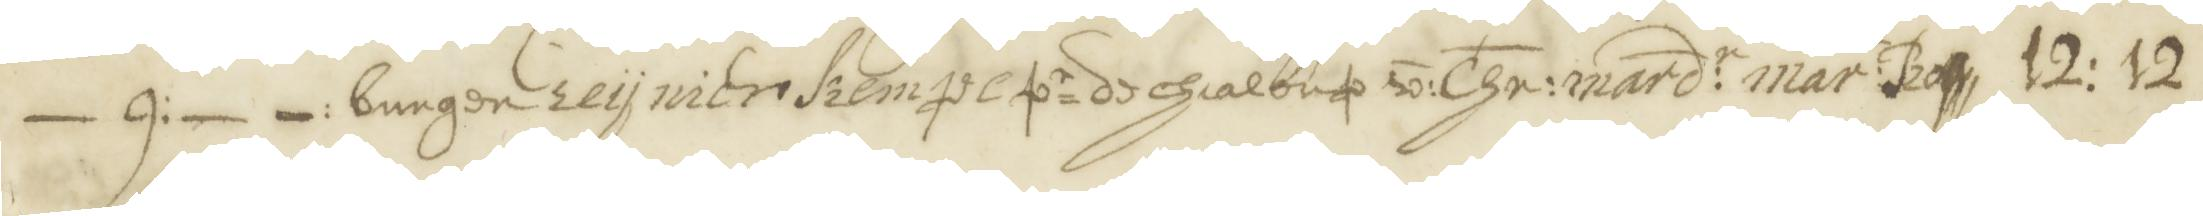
— 9: — —: burger reijnier kempe p=r de chialoup w: Chr: mard:r mar: kopp„ 12: 12
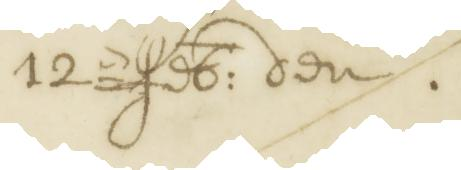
12=en feb: den .
